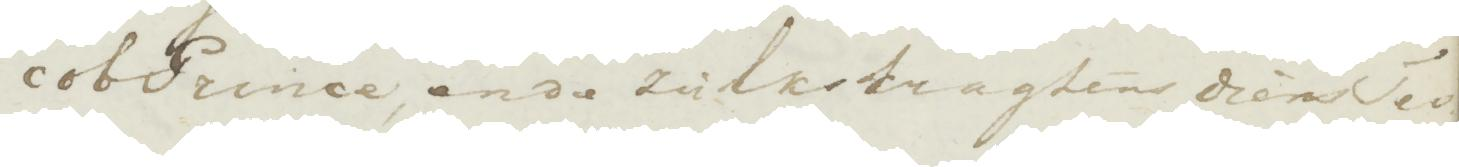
cob Prince, ende zulks tragtens diens Tes
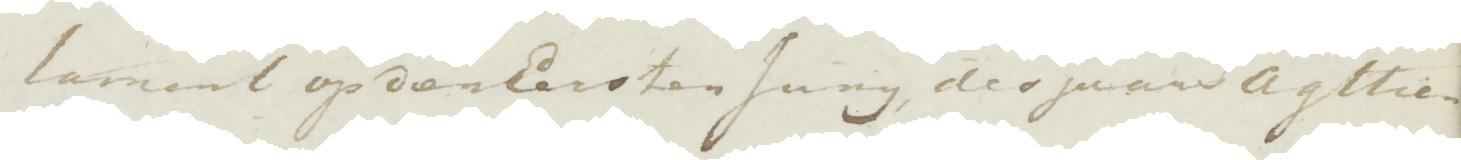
tament op den Eersten Junij, des jaars Agttien
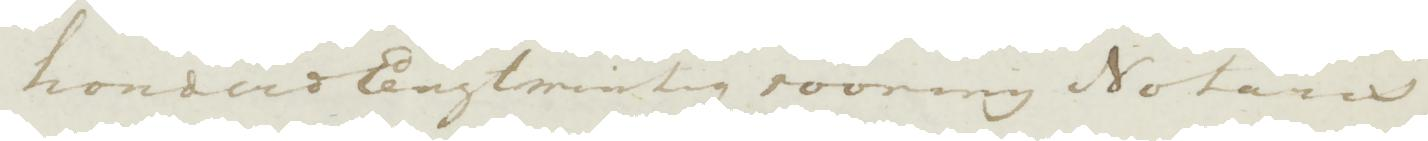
honderd Eenentwintig voor my Notaris
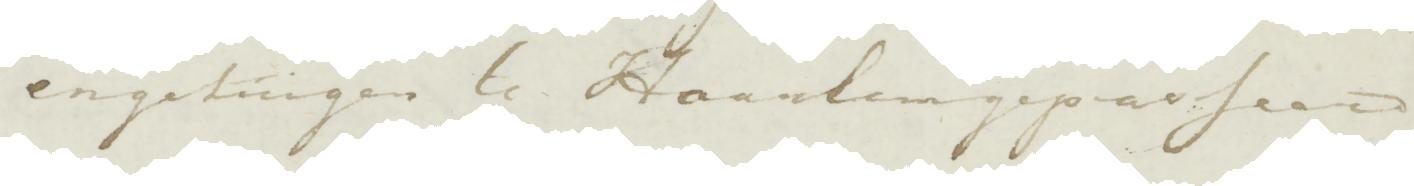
en getuigen te Haarlem gepasseerd
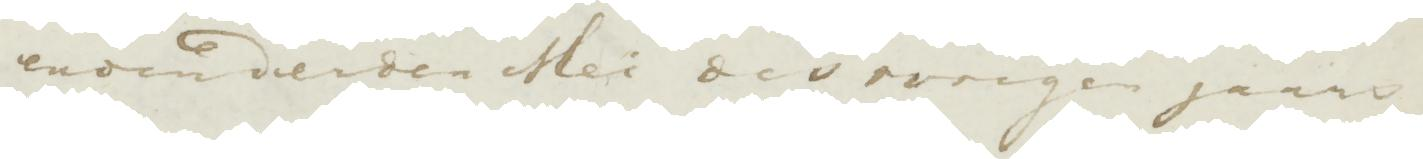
en den derden Mei des vorigen jaars
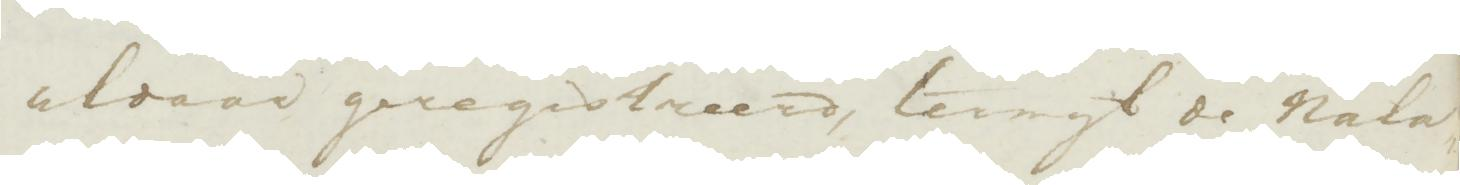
aldaar geregistreerd, terwyl de Nala„
